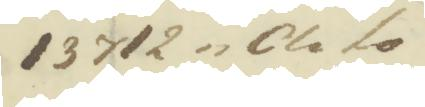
137 12 „ dito
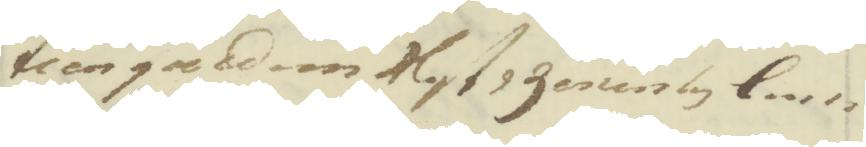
tien guldens Vyf en zeventig Cent
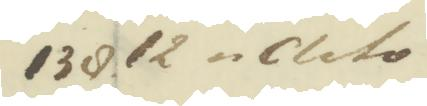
138. 12 „ dito
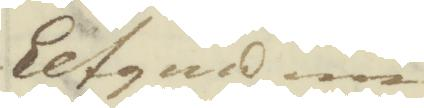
Elf guldens
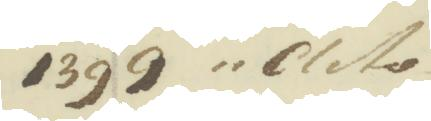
139 9 „ dito
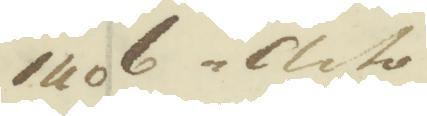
140 6 „ dito
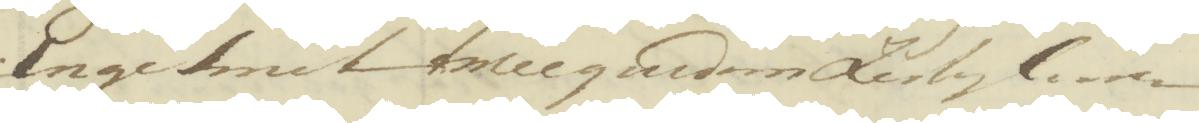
Engesmit twee guldens Zestig Cent
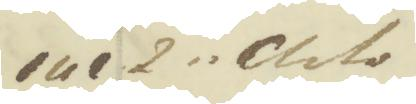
141. 2 „ dito
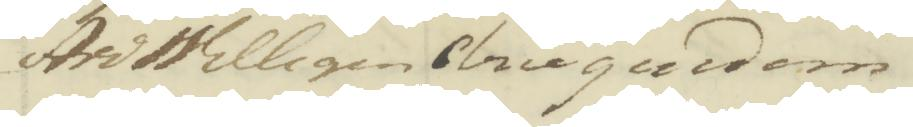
A v d Willigen drie guldens
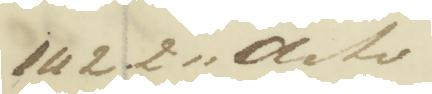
142. 2 „ dito
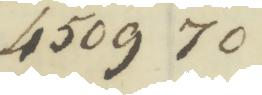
4509 70
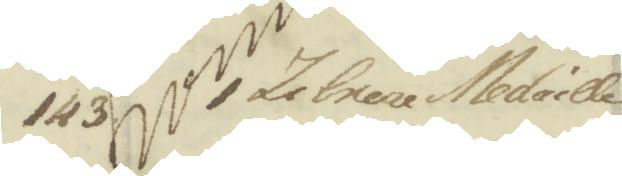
143. 1 zilvere Medaille
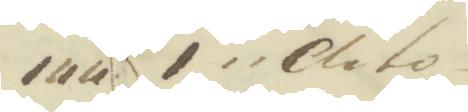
144. 1 „ dito
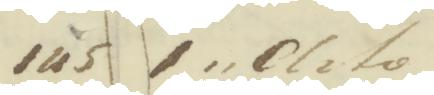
145 1 „ dito
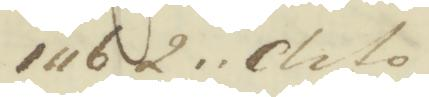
146 2 „ dito
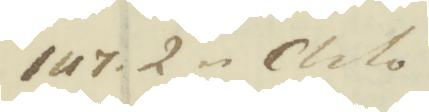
147. 2 „ dito
